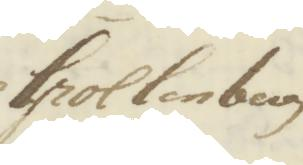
Groltenberg
